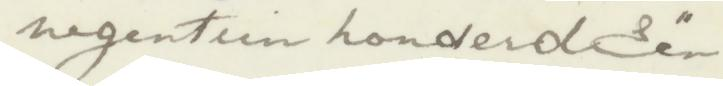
negentien honderd Één
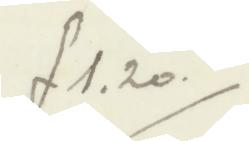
ƒ 1.20.
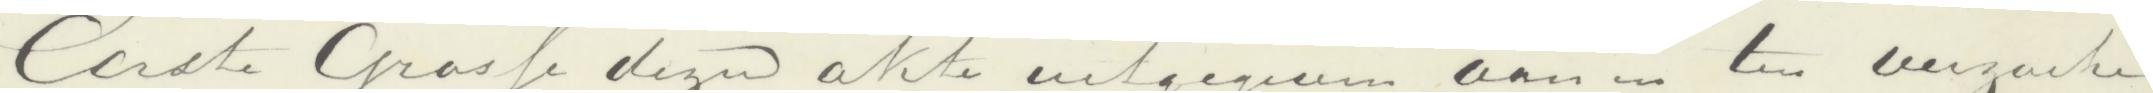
Eerste Grosse dezer akte uitgegeven aan en ten verzoeke
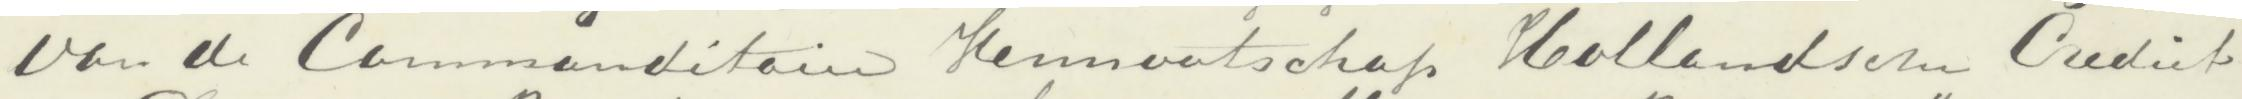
van de Commanditaire Vennootschap Hollandsche Crediet
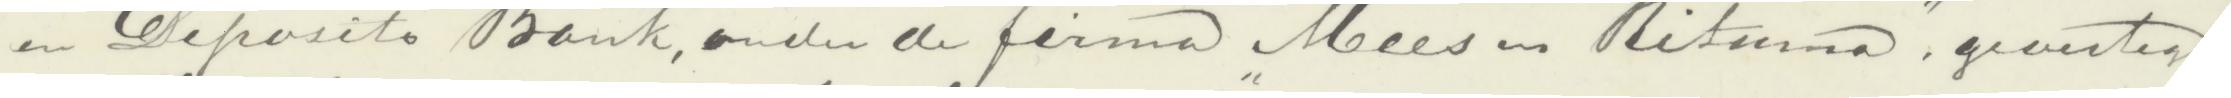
en Deposito Bank, onder de firma „Mees en Ritsema", gevestigd
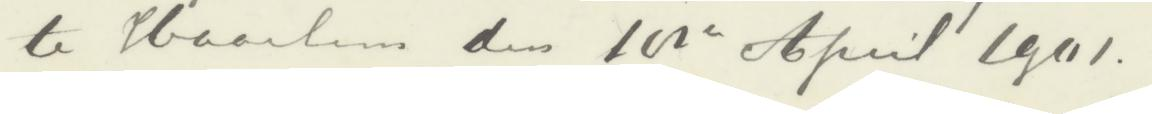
te Haarlem den 18e April 1901.
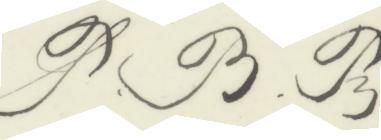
P.B.Pz
